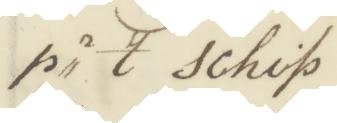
p„r ’t schip
